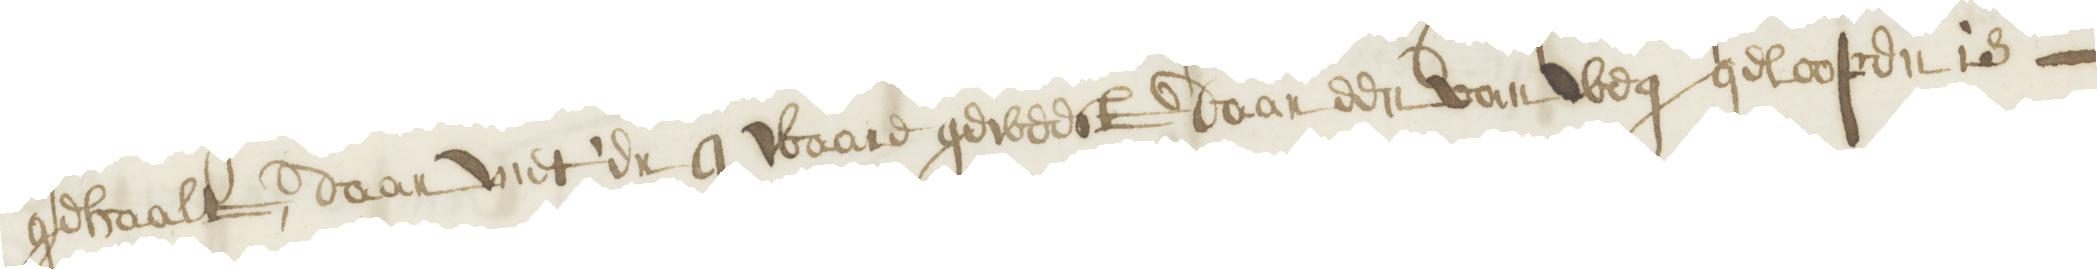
gehaalt, daar met 'er 9 waare geweest daar den van weg geloopen is —
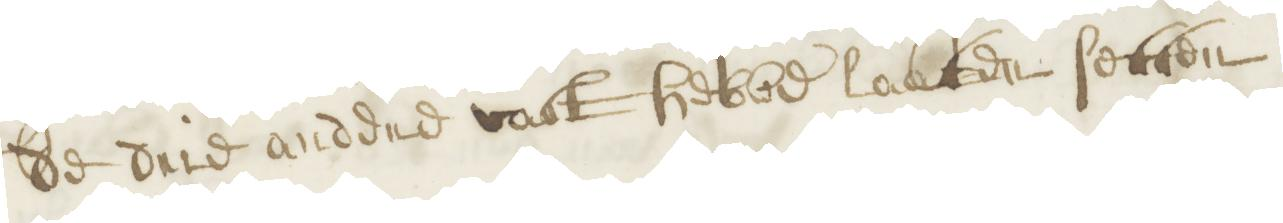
de drie andere vast hebbe laaten setten
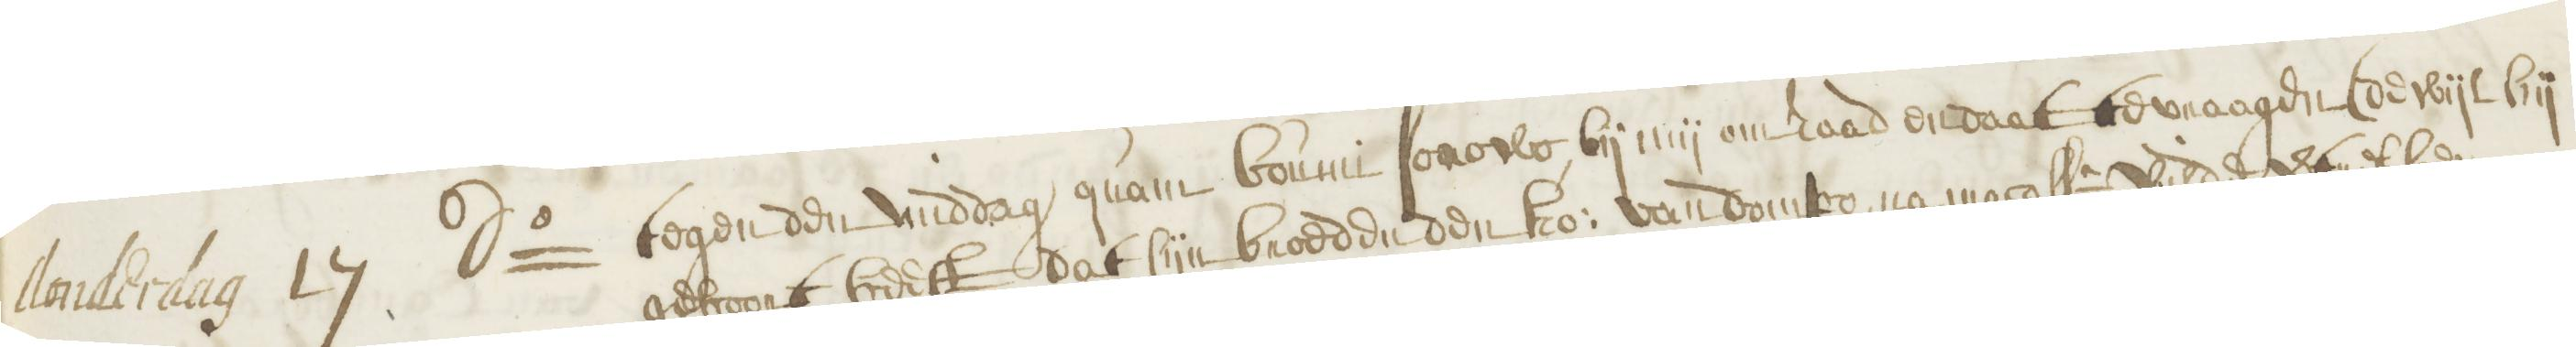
donderdag 17 d=o tegen den middag quam bouni sorowo, bij mij om raad en daat te vraagen (de wijl hij
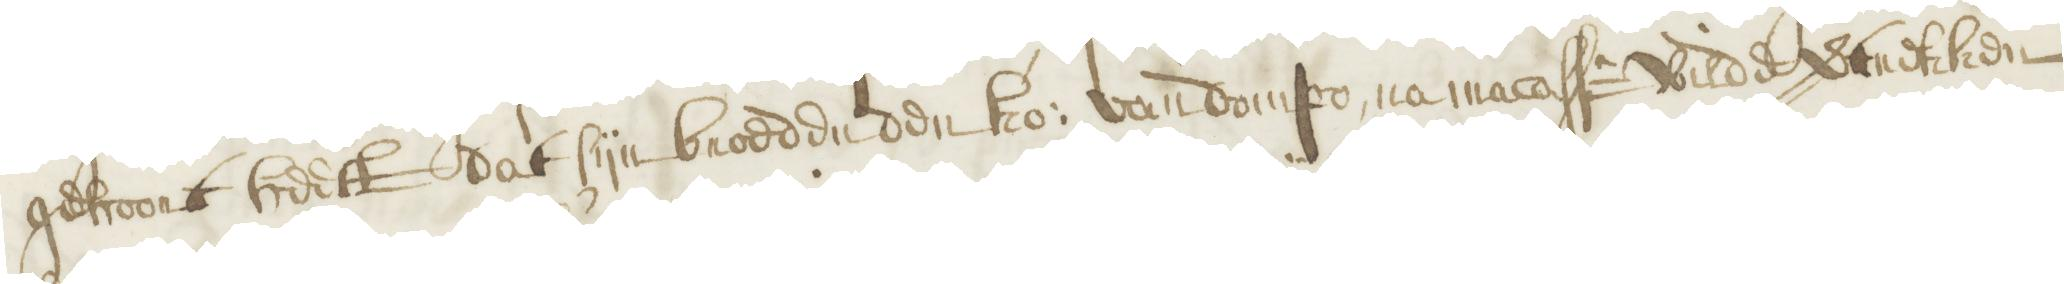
gehoort heeft dat sijn broeder den ko: van dompo, na macass=r wilde vertrekken
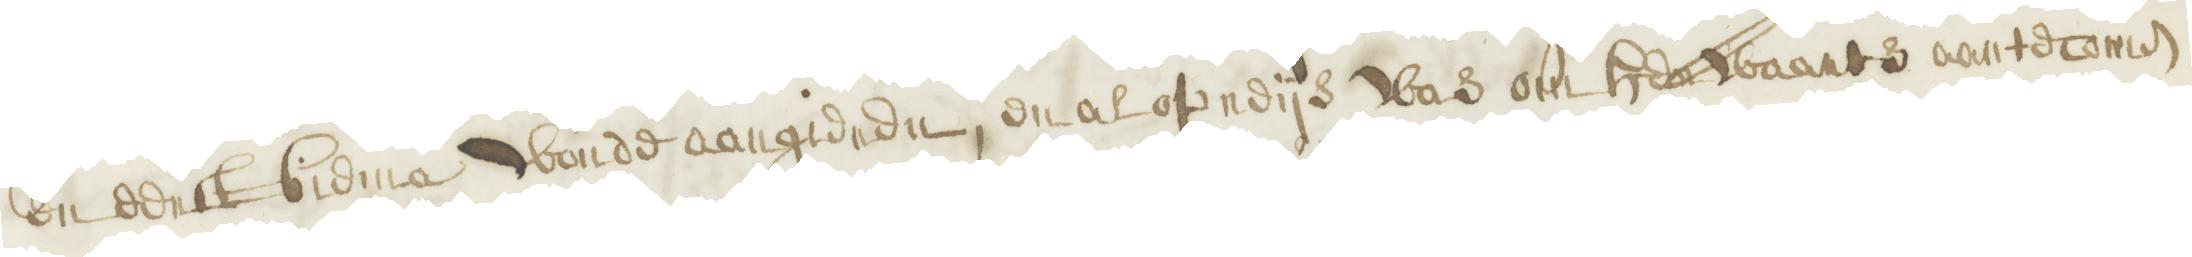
en eerst biema woude aangieren, en al op reijs was om herwaarts aantecomen
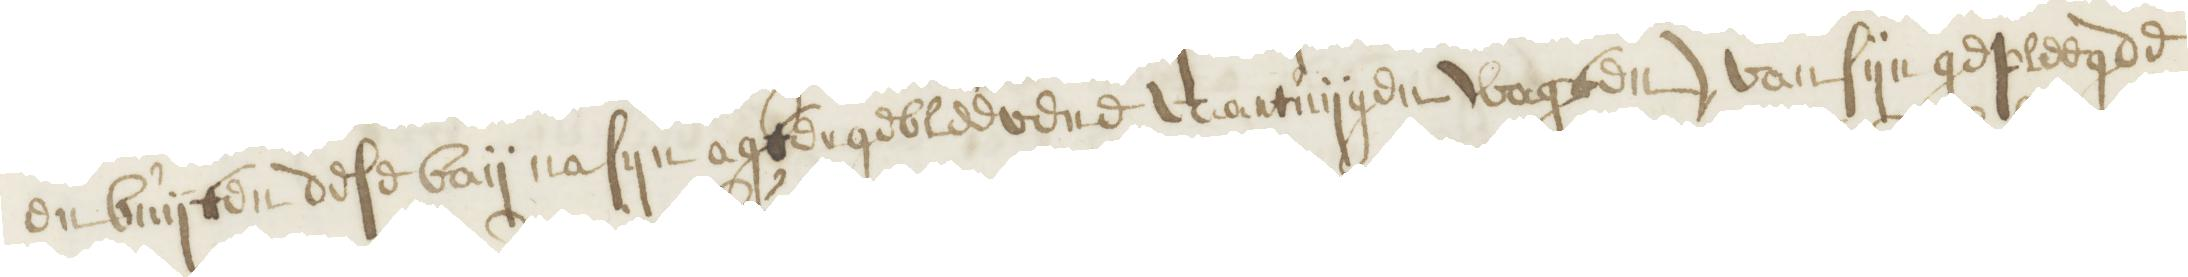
en buijten dese baij na sijn agter gebleevene vaartuijgen wagten) van sijn gepleegde
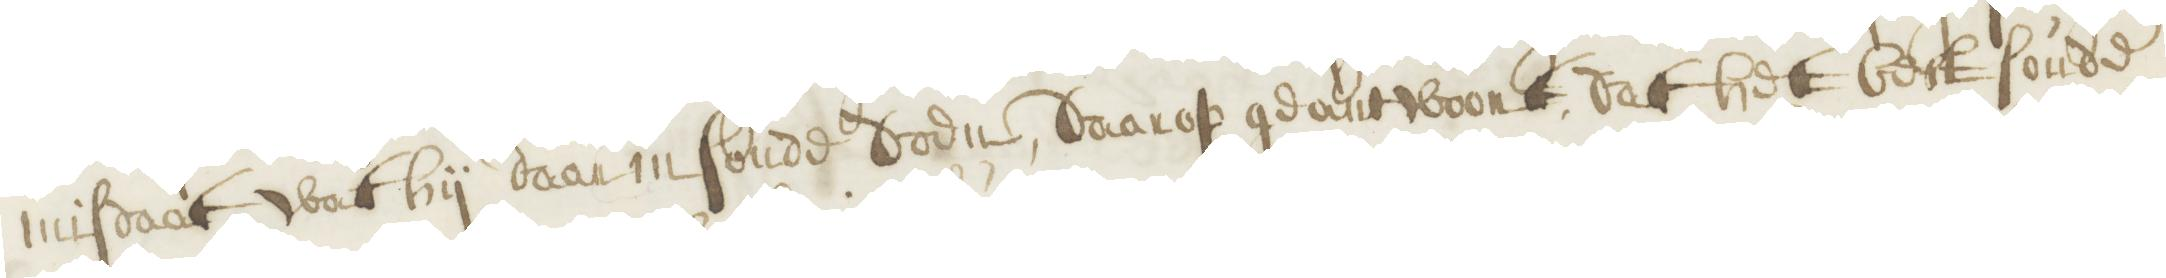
misdaat, wat hij daar in soude doen, daarop geantwoort, dat het best soude
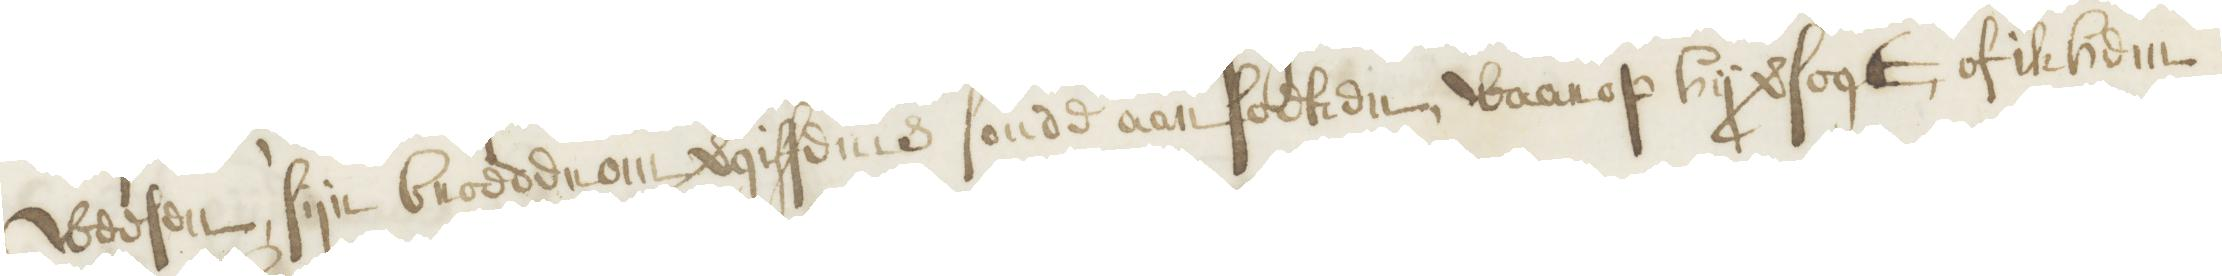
weesen, sijn broeder om vergiffenis soude aansoeken, waarop hij versogt, of ik hem
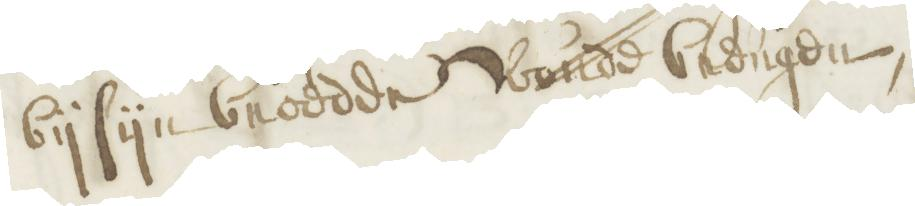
bij sijn broeder woude brengen,
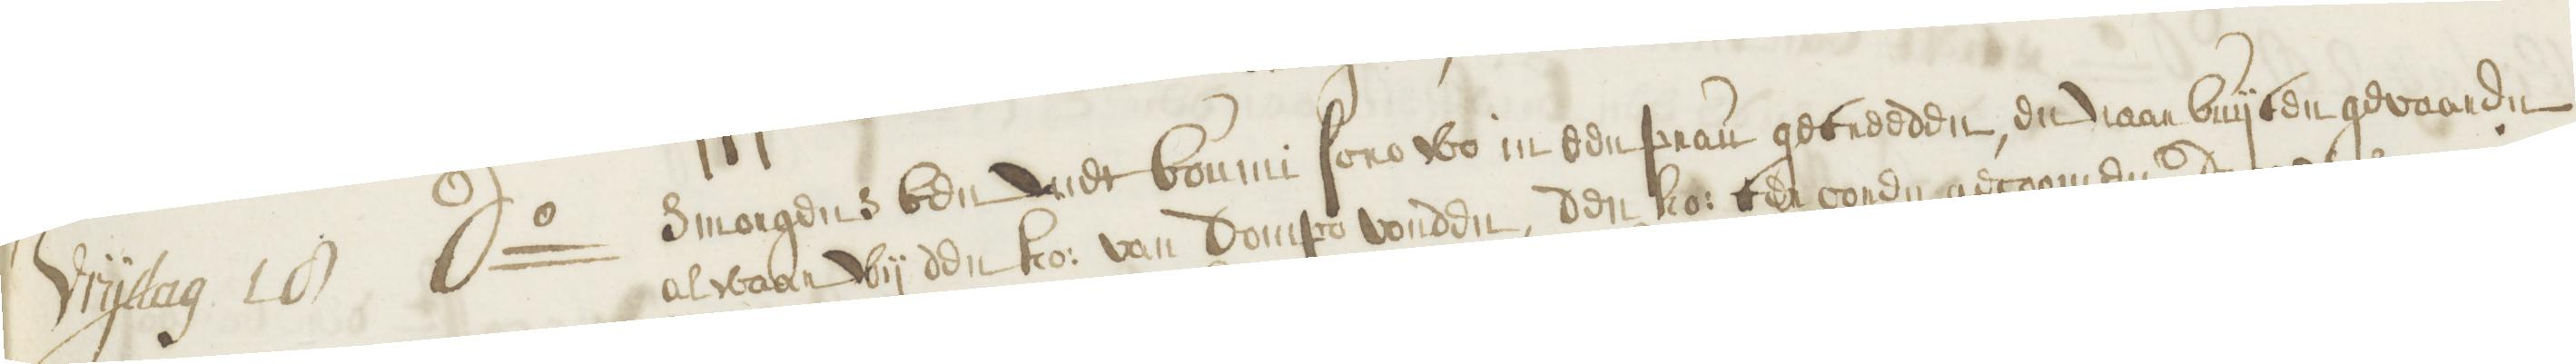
Vrijdag 18 d=o smorgens ben met boumi sorowo in den prau getreeden, en naar buijten gevaaren
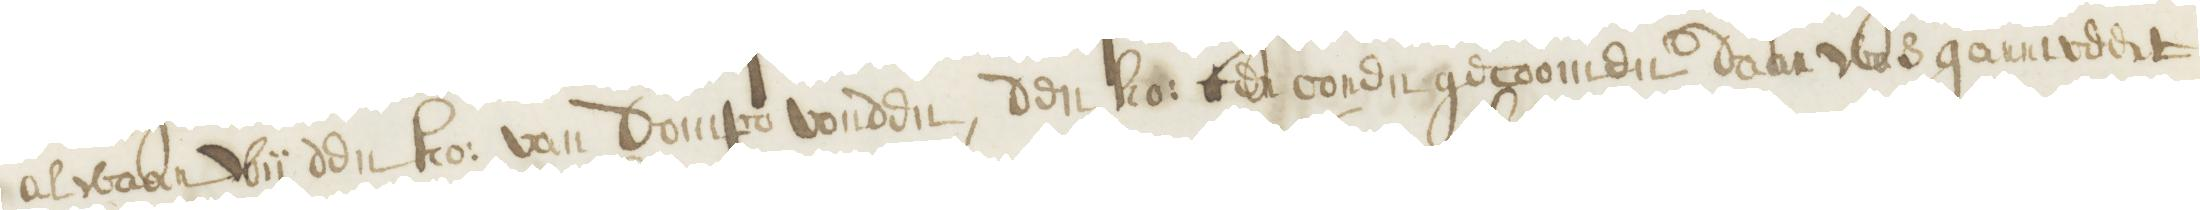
alwaar wij den ko: van dompo vonden, den ko: ter ooren gecoomen daar was garriveert
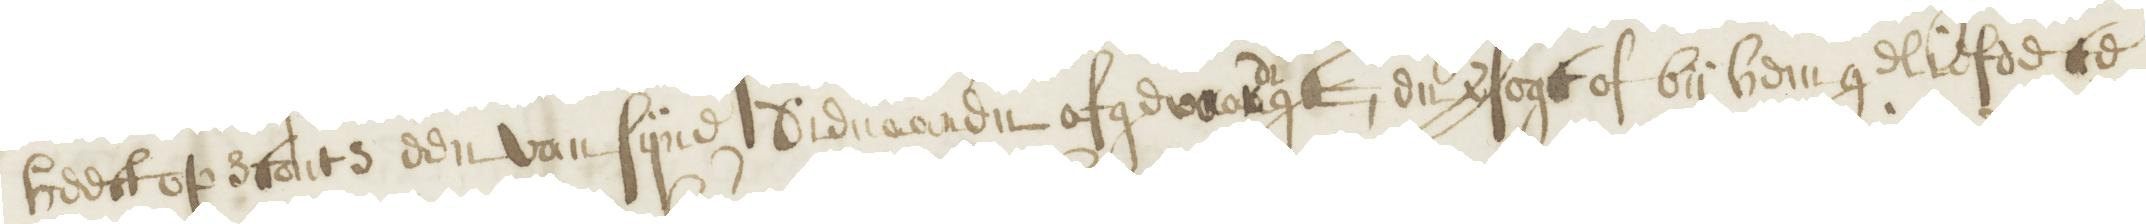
heeft op stonts een van sijne dienaaren afgevaardigt, en versogt of bij hem geliefde te
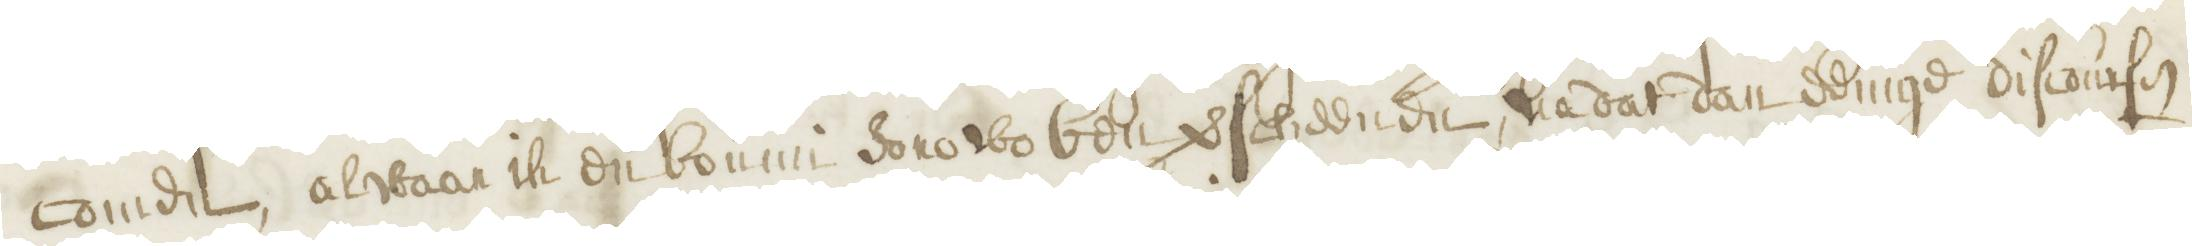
comen, alwaar ik en boumi sorowo ben verscheenen, na dat dan eenige discoursen
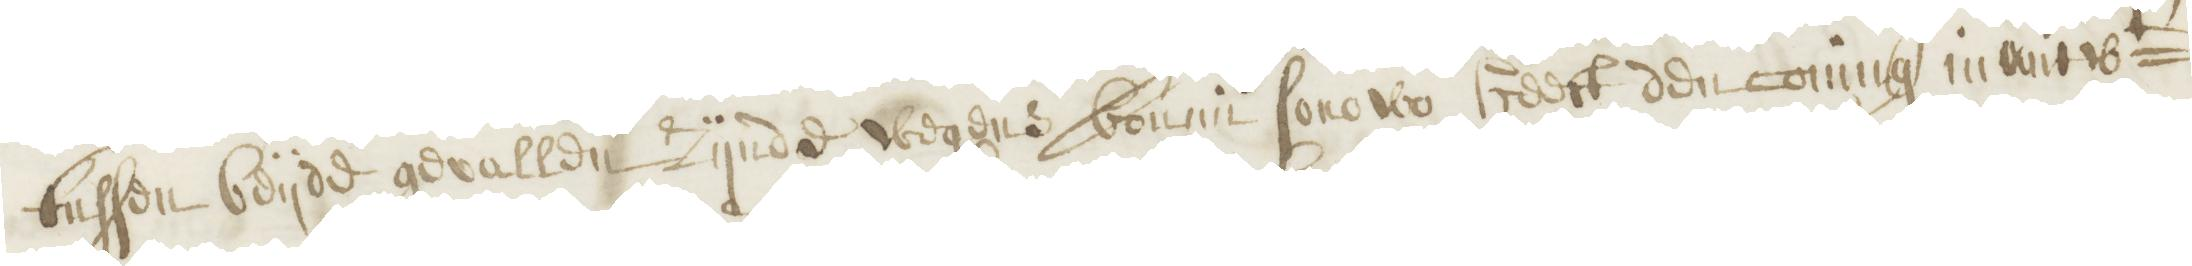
tussen beijde gevallen zijnde wegens bouni sorowo heeft den coning in antw=t
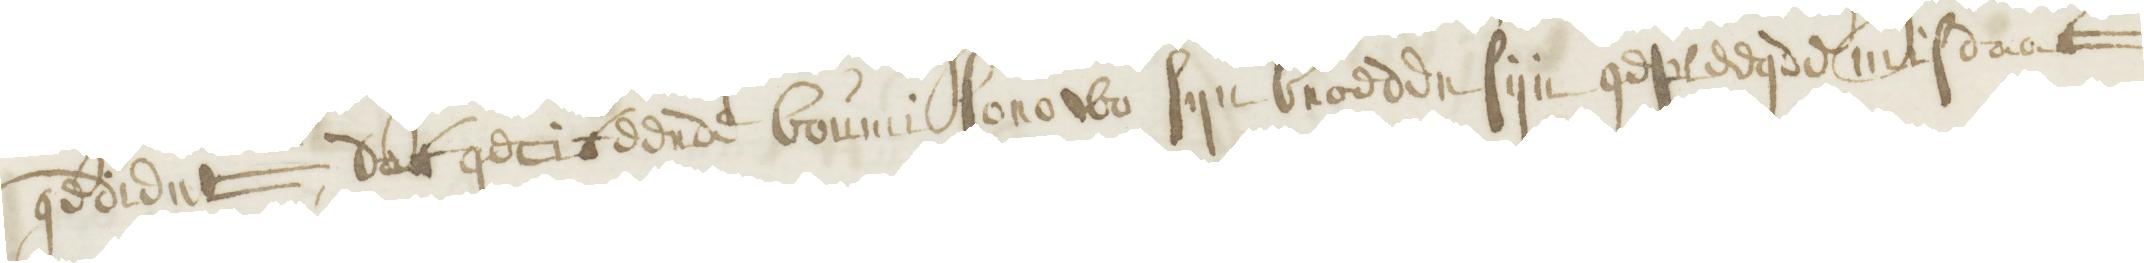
gedient, dat geciteerde boumi sorowo sijn broeder sijn gepleegde misdaat
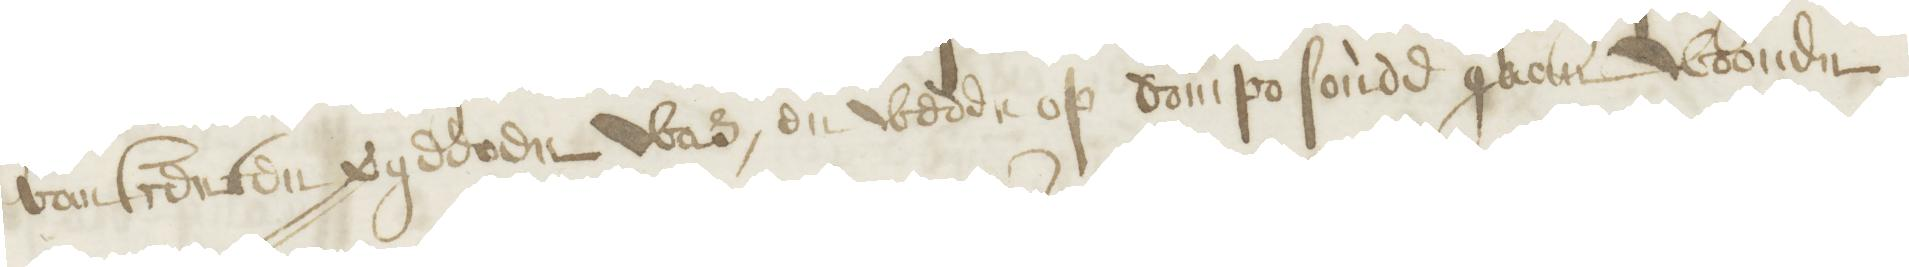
van herten vergeeven was, en weder op dompo soude gaan woonen
